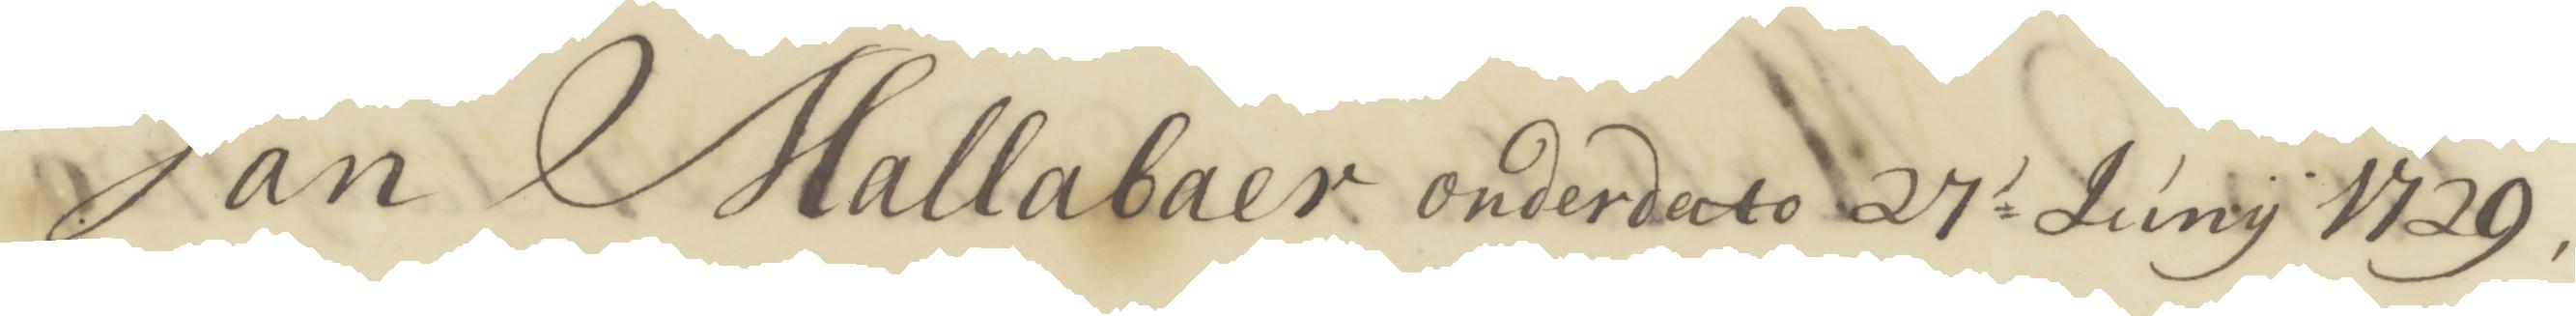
Van Mallabaer onder dato 27=' Iunij 1729
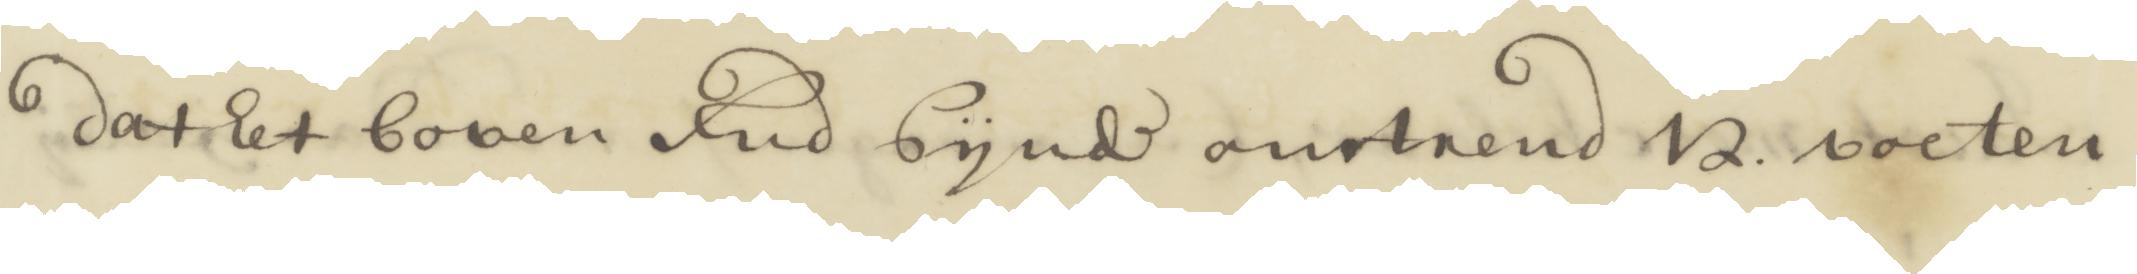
dat het boven End sijnde omtrend 12. voeten
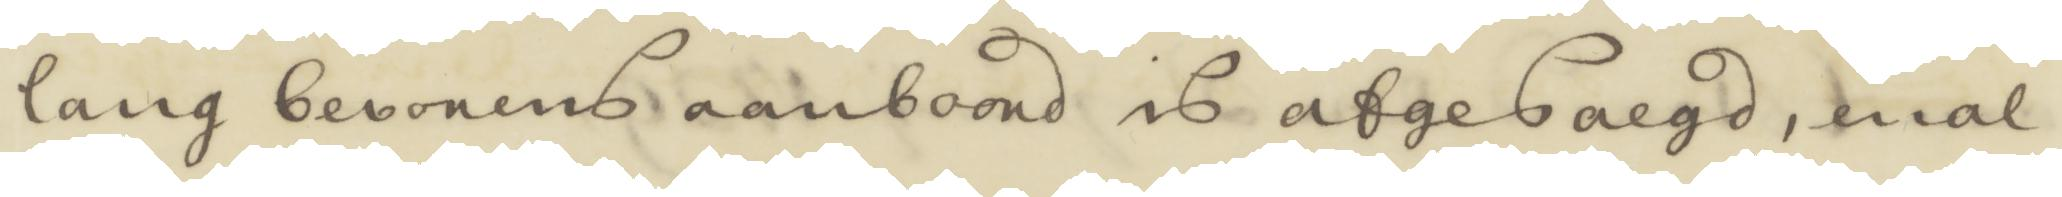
lang bevorens aanboord is afgesaegd, en al
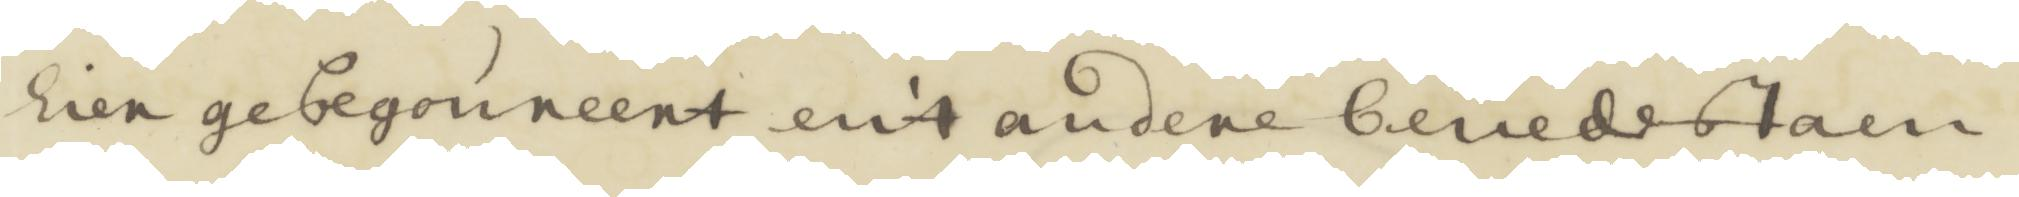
hier gesegoureert en ’t andere benede staen
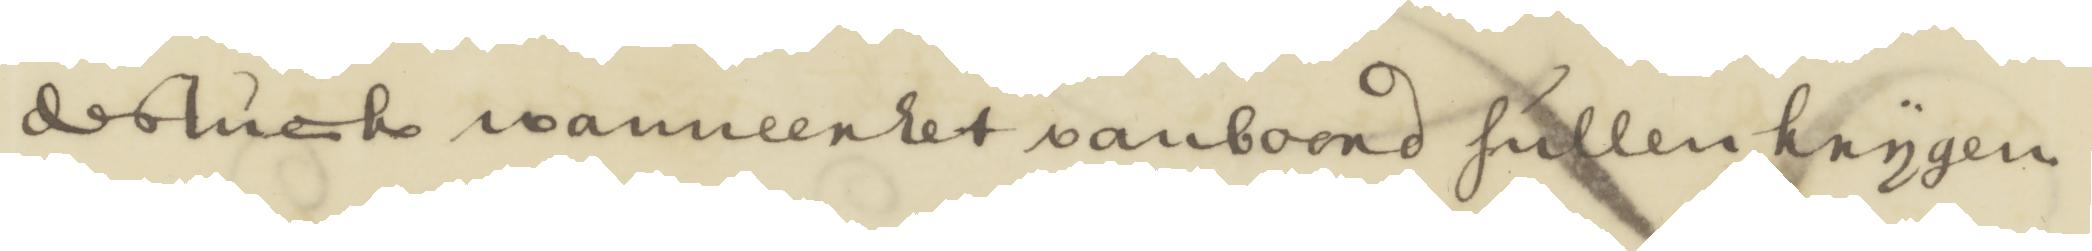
de stuck wanneer het vanboord sullen krijgen
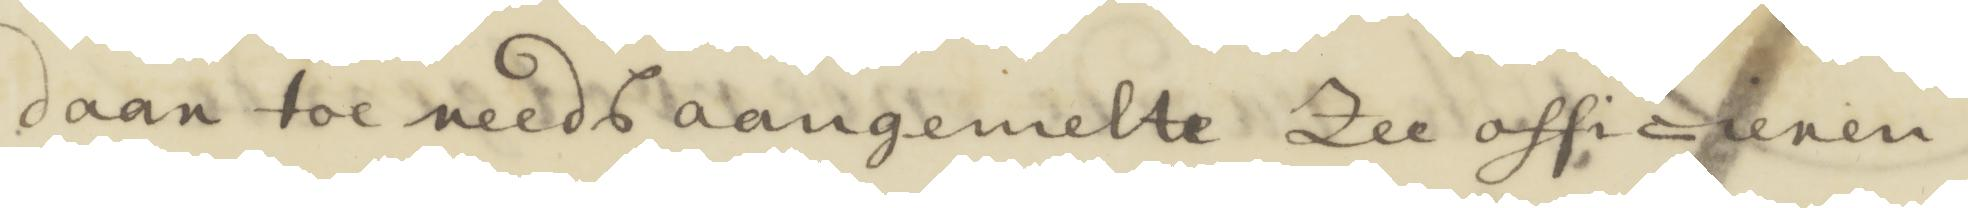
daar toe reeds aangemelte zee officieren
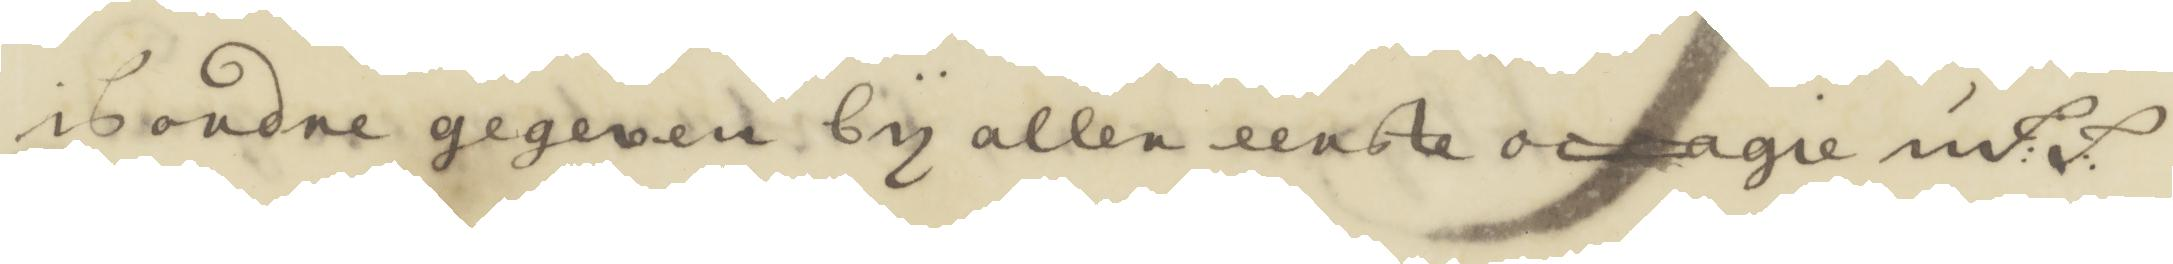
is ordre gegeven bij aller eerste occagie uE: E:
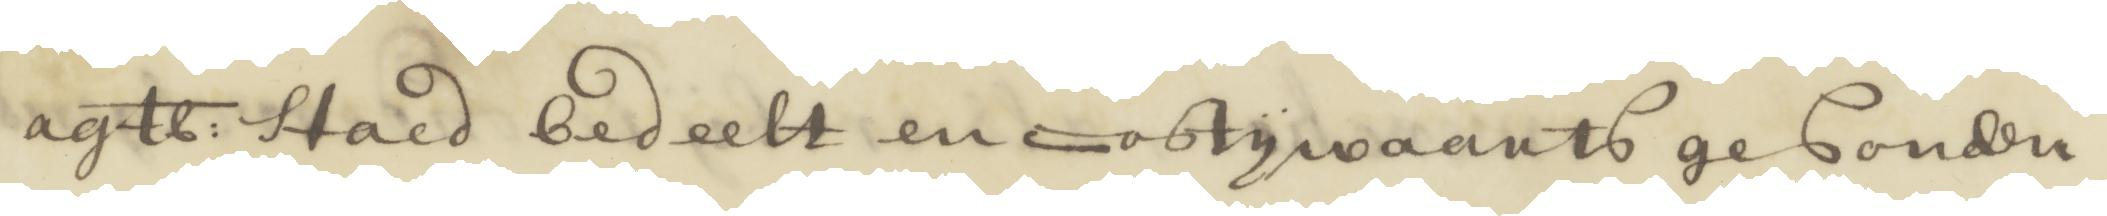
agtb: staed bedeelt en costijwaarts gesonden
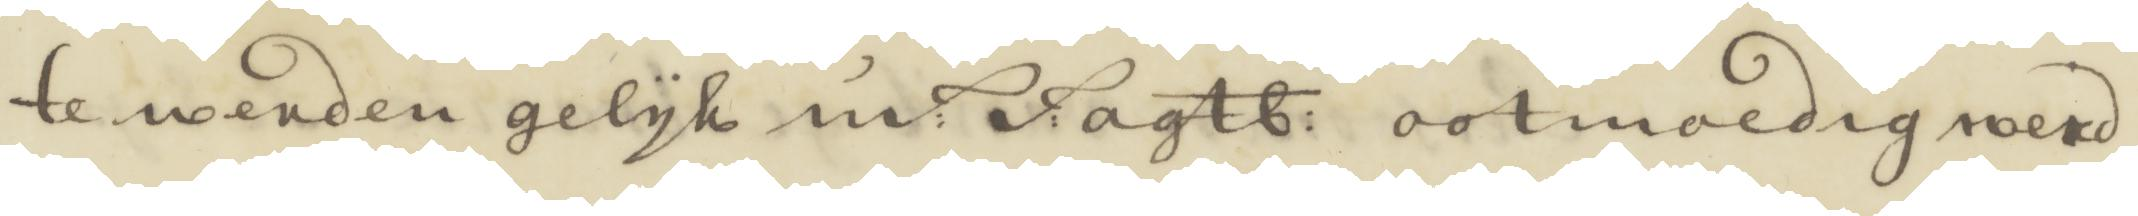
te werden gelijk uE: E: agtb: ootmoedig werd
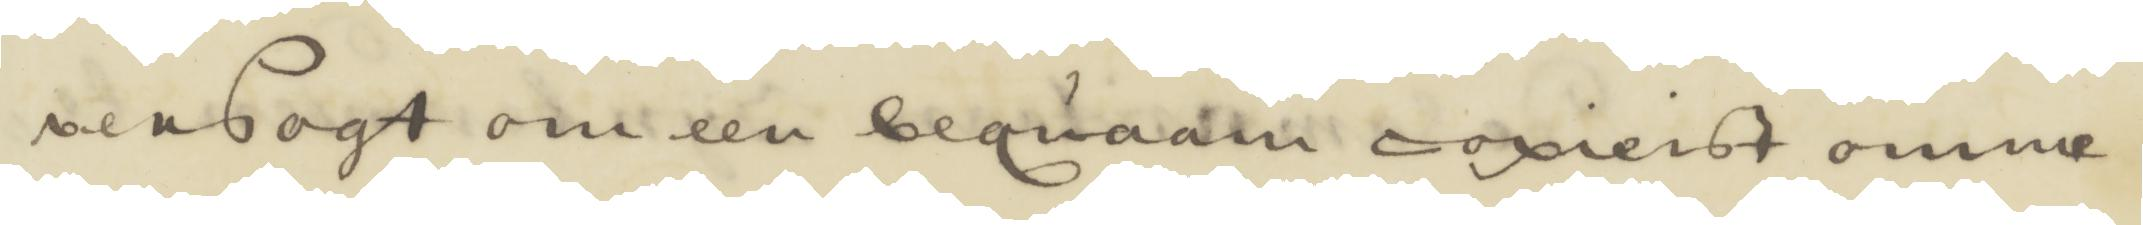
versogt om een bequaam copieist omme
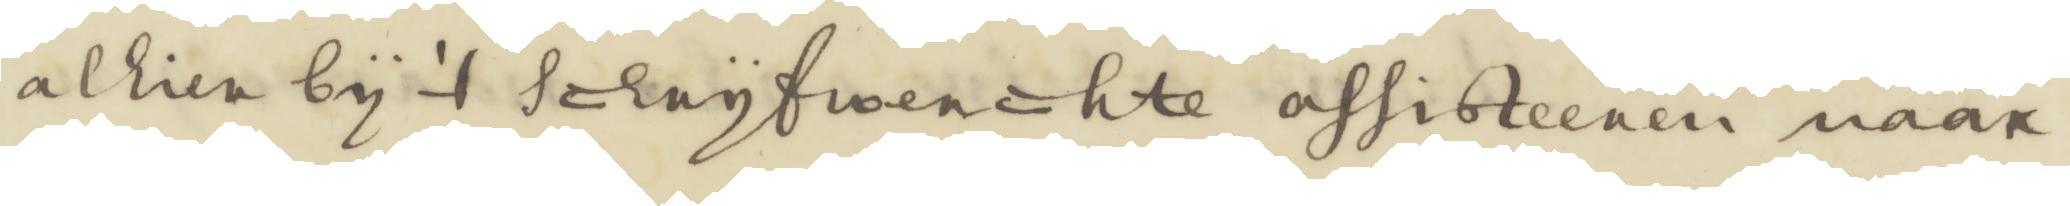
alhier bij ’t schrijfwerck te assisteeren naar
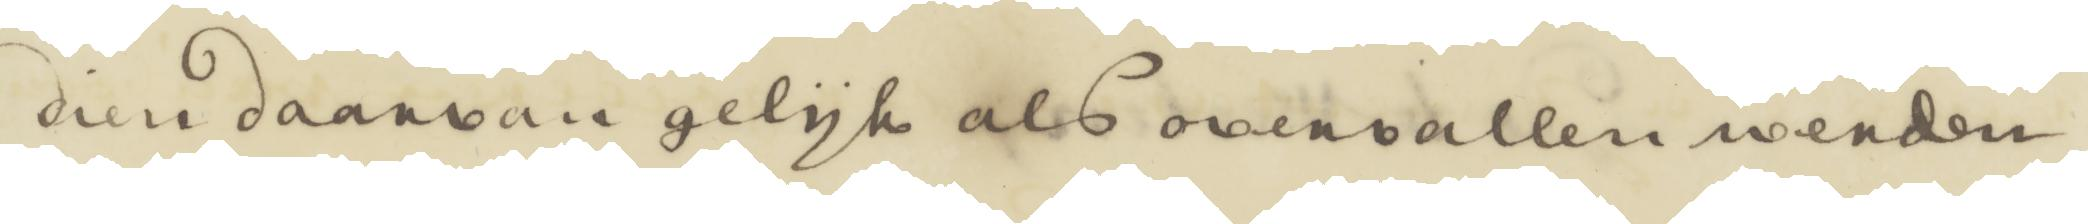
dien daarvan gelijk als overvallen werden
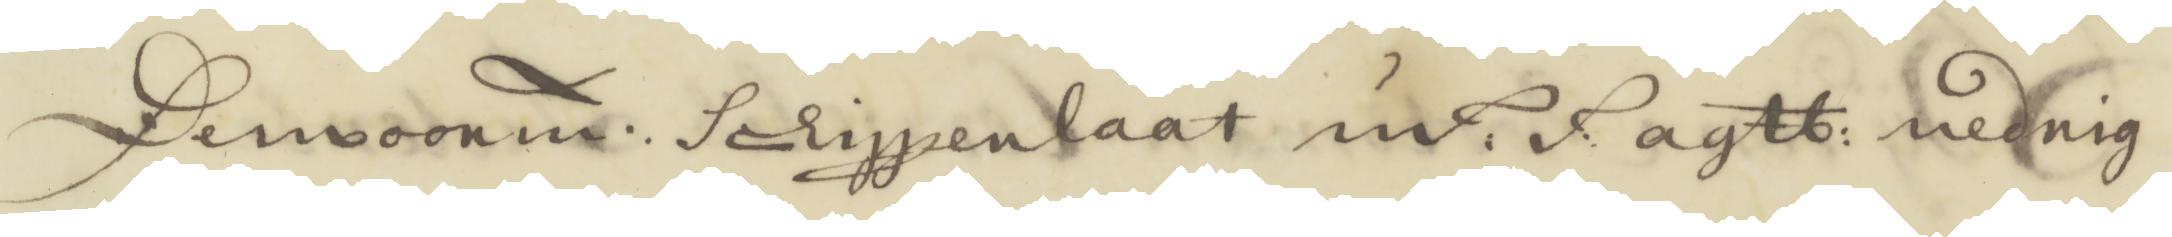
Den voorm: schipper laat uE: E: agtb: nedrig
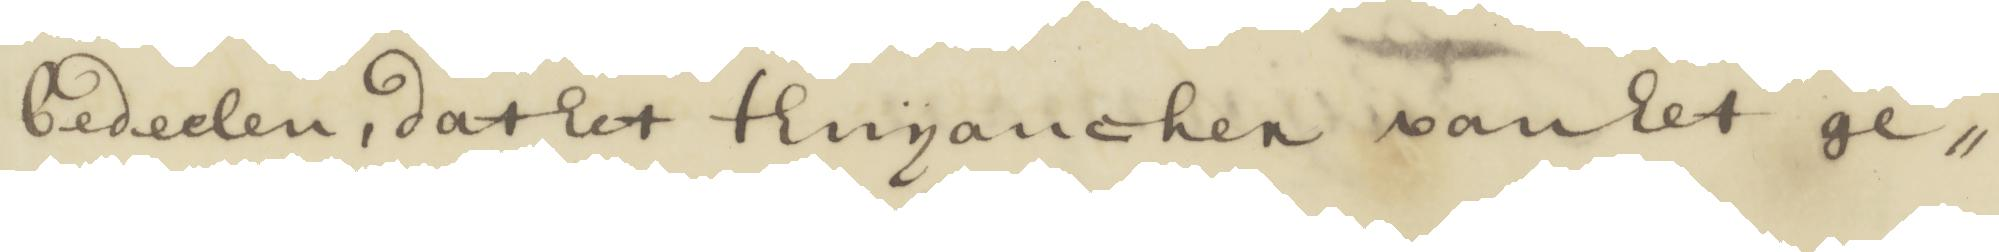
bedeelen, dat het thuijancker van het ge„
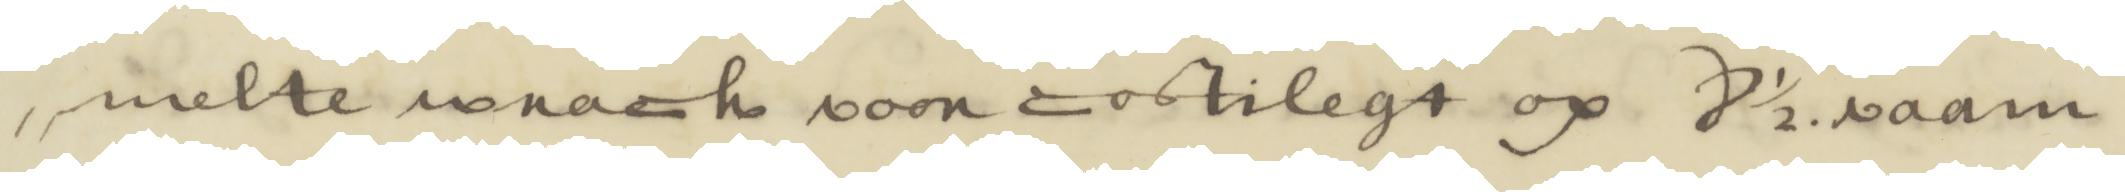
„melte wrack voor costilegt op 8½. vaam
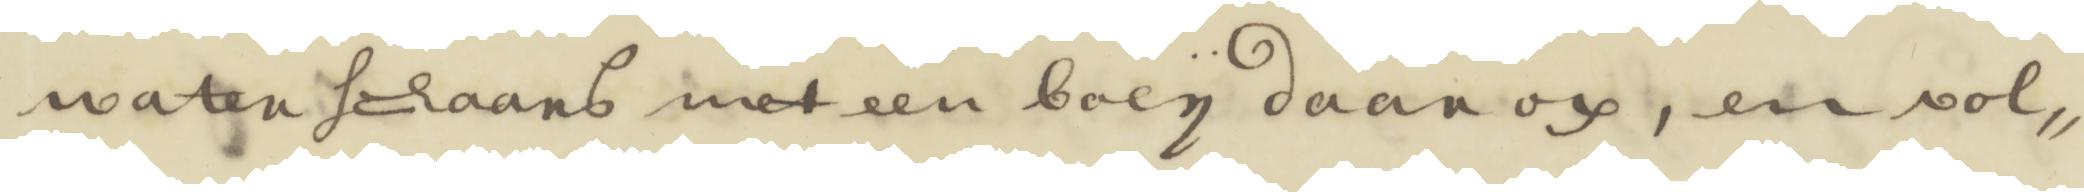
waterschaars met een boeij daar op, en vol„
